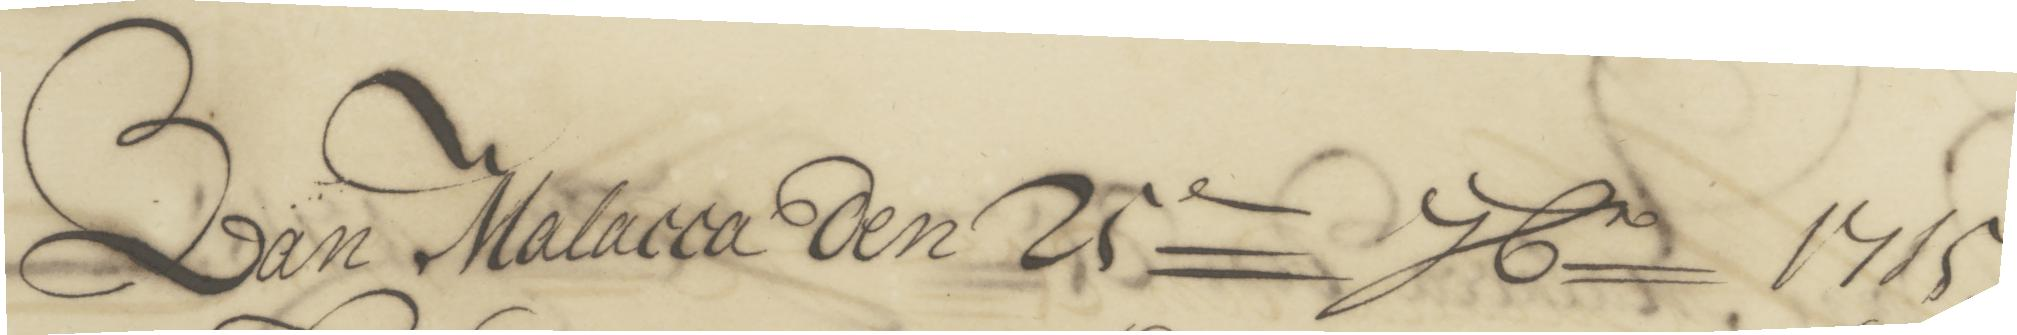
Van Malacca den 25=e 7b=r 1715.
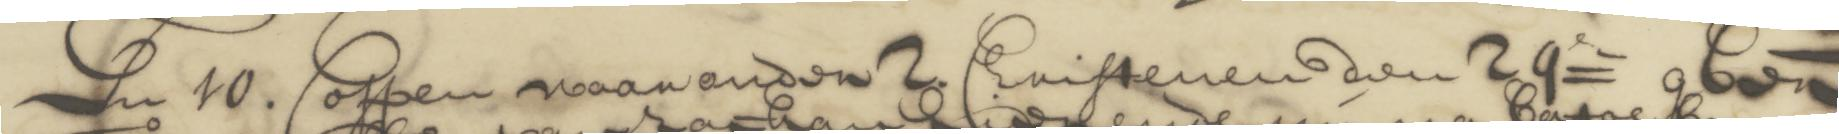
En 10. Coppen waar onder 2. Christenen den 24=e gber
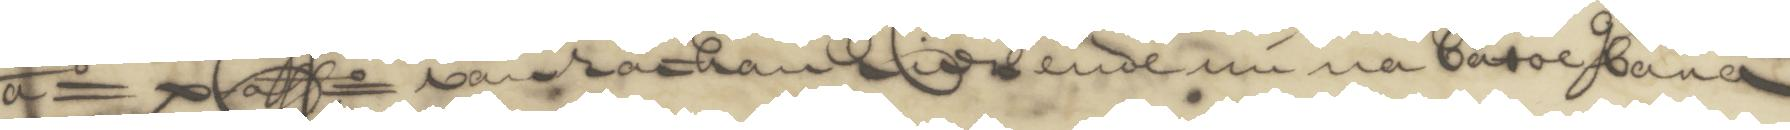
a=o pass=o van rackan hier ende nu na batoe bara
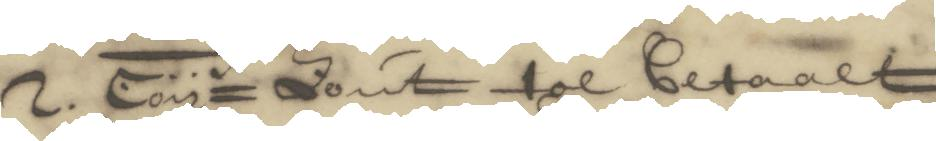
2. Coij=s Zout tol betaalt
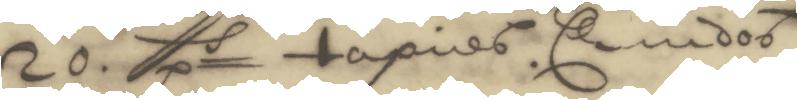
20. p=s tapies Chindos
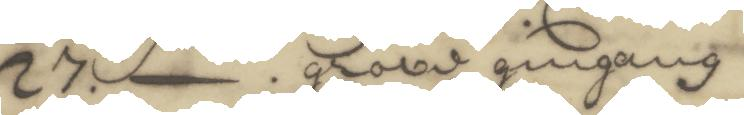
27. —. grove gingang
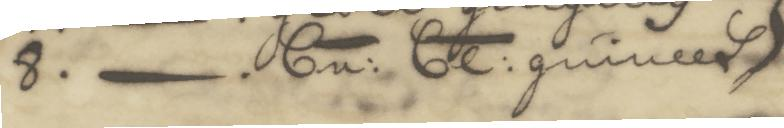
8. —. br: bl: guinees }
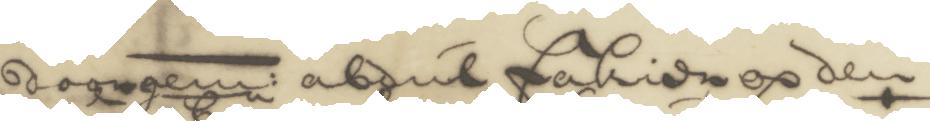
doorgem: abdul fakier op den
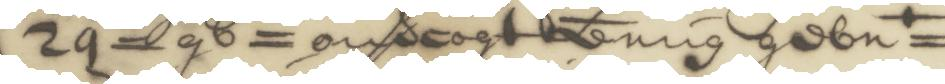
24=' gb=r onvercogt terug gebr=t
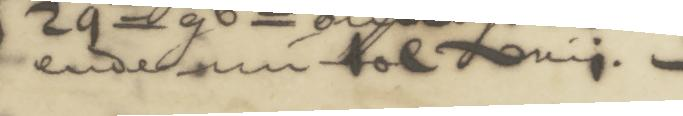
ende nu tol Vrij.-
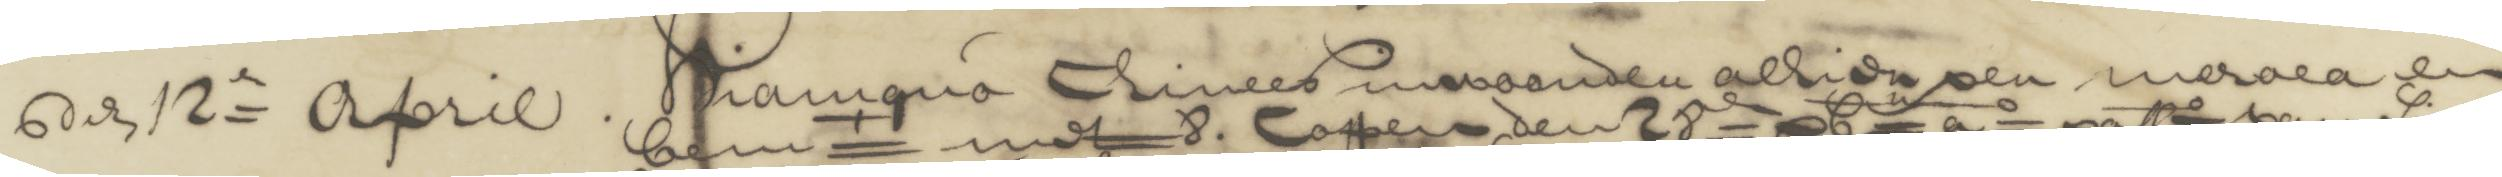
den 12=e April Hiamquo Chinees inwoonder alhier per merala en
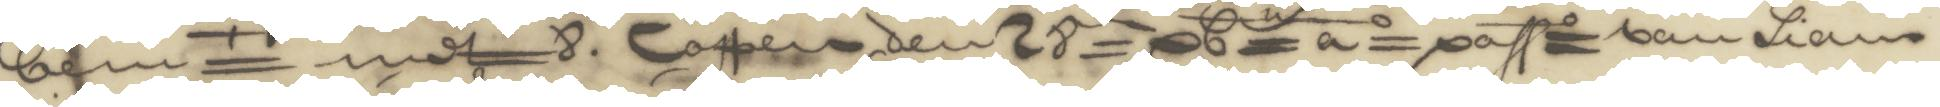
bem=t met 8. Coppen den 28=e xb=r a=o pass=o van Siam
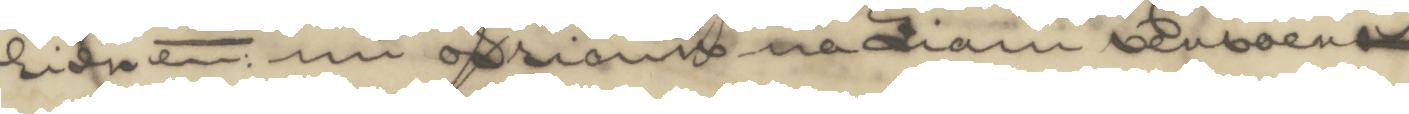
hier en: nu over riouw na Ziam vervoert
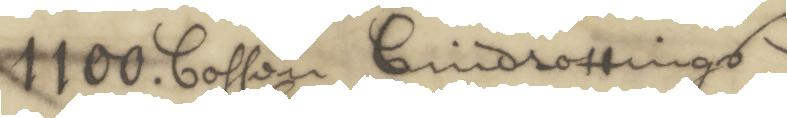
1100. bossen bindrottings
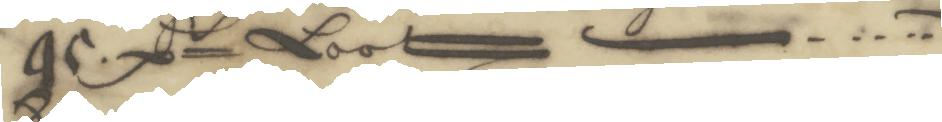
45. p=s Loot — .....
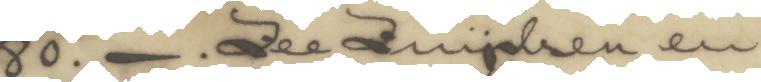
80. – . Zee Zuijker en
